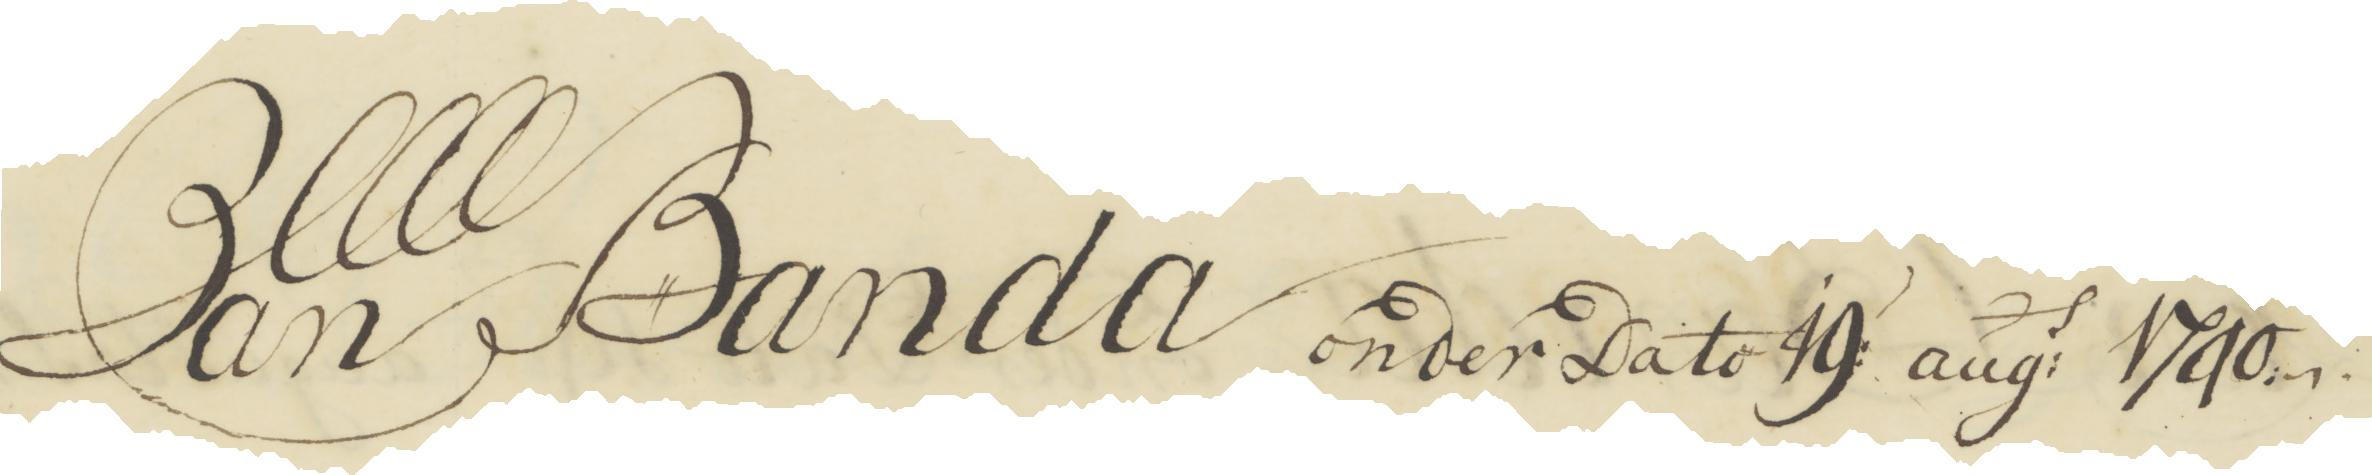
Van Banda onder Dato 19:' aug:s 1740.-.
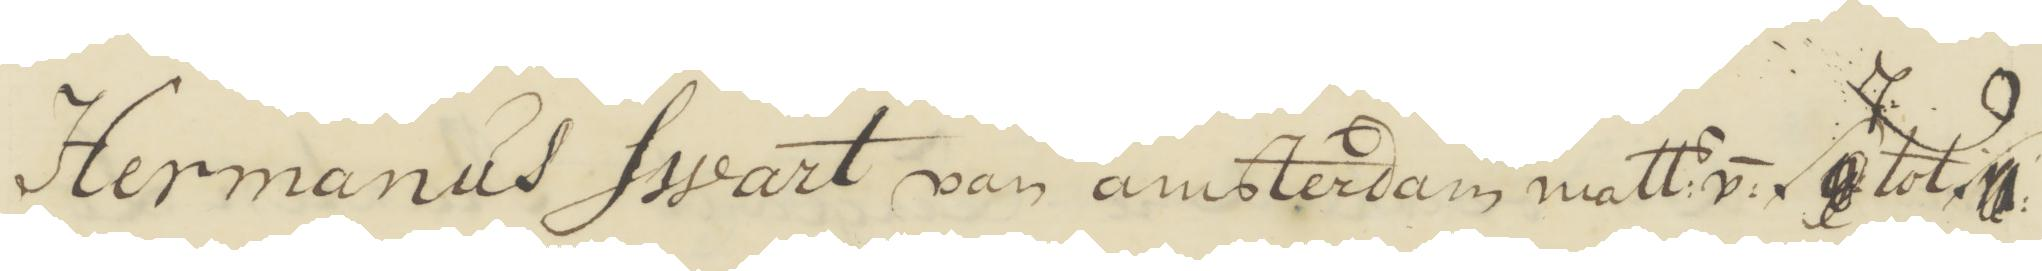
Hermanus Swart van amsterdam matt:s v: ƒ 7: tot ƒ 9
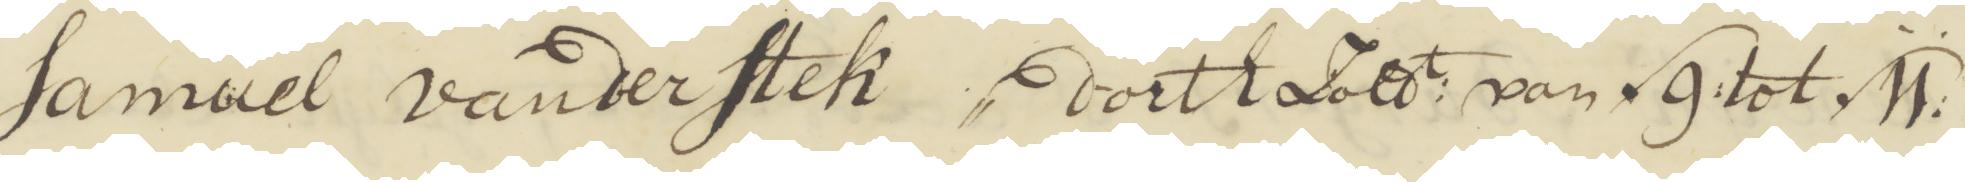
samuel van der stek „ dorth zold:t van ƒ9: tot 11:
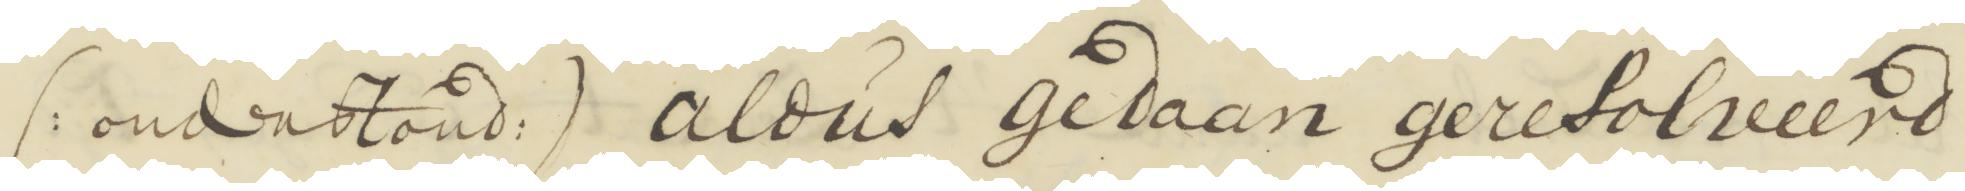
(:onderstond:) aldus gedaan geresolveerd
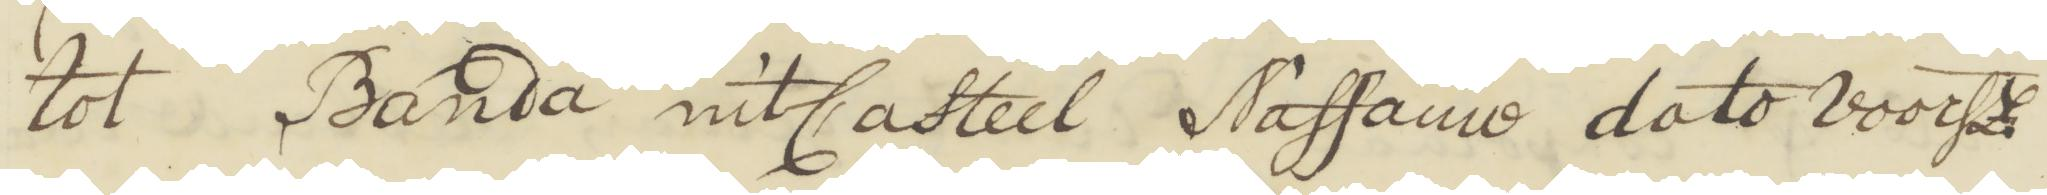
tot Banda in'tCasteel Nassauw dato voorsz
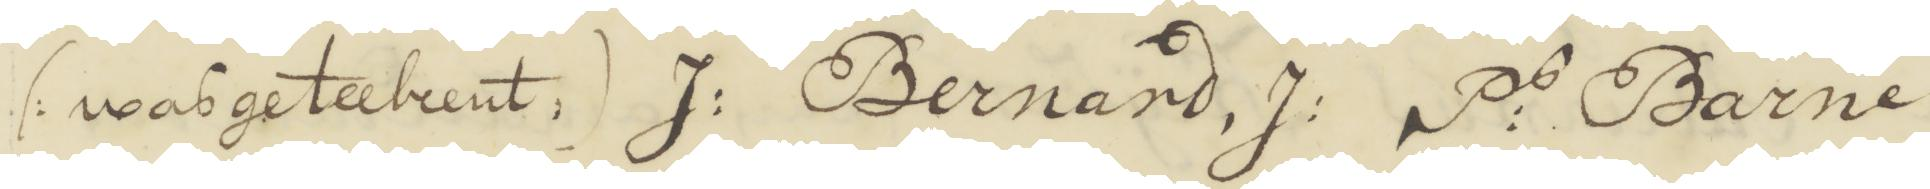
(:was geteekent:) J: Bernard, J: P:s Barne
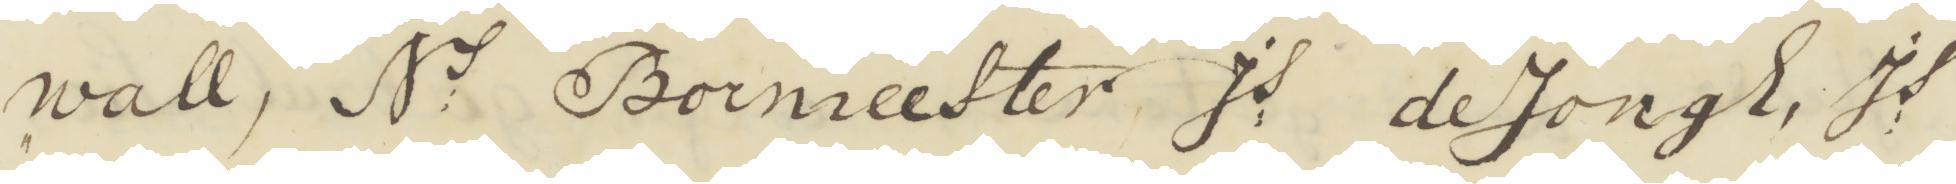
„wall, N:s Bormeester J:s deJongh, J:s
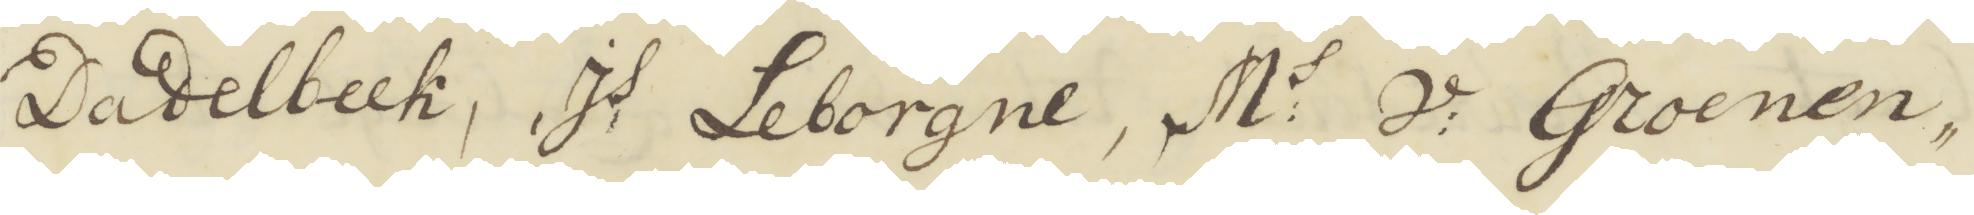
Dadelbeek, ,J:s Leborgne, M:s V: Groenen„
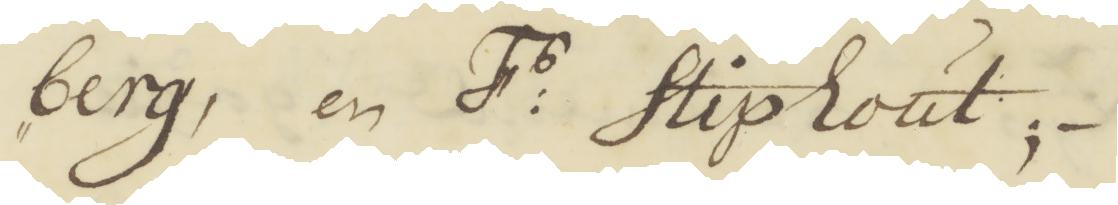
berg, en F:s stiphout;-
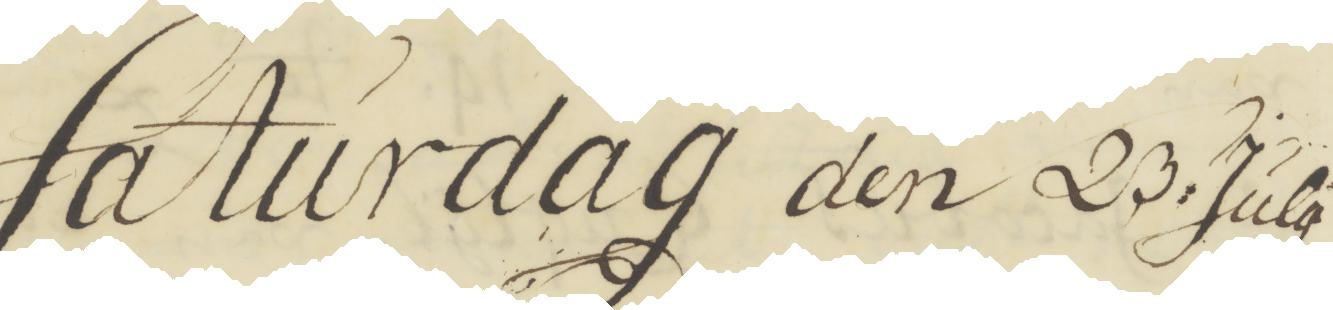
Saturdag den 23:' Julij
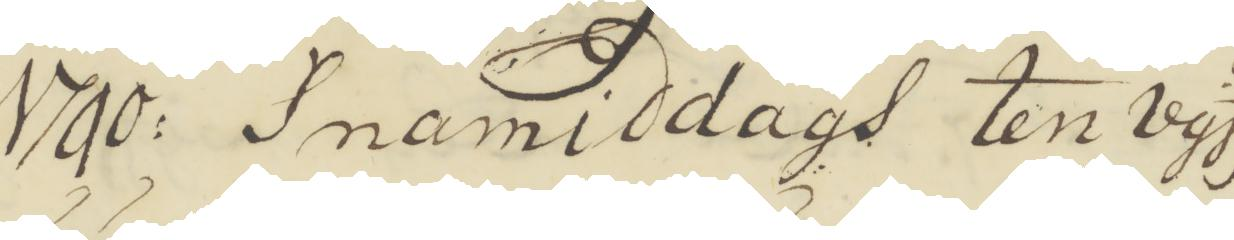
1740: 's namiddags ten vyff
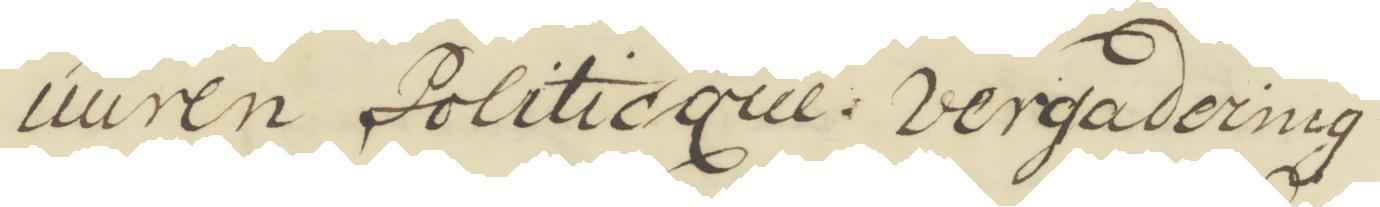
uuren Politicque: vergadering
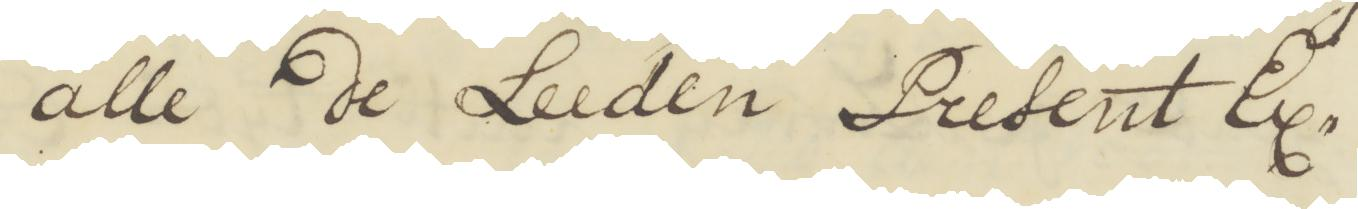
alle de Leeden Present Ex„
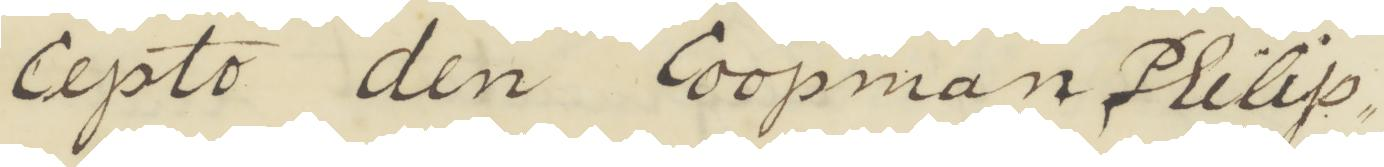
cepto den Coopman Philip„
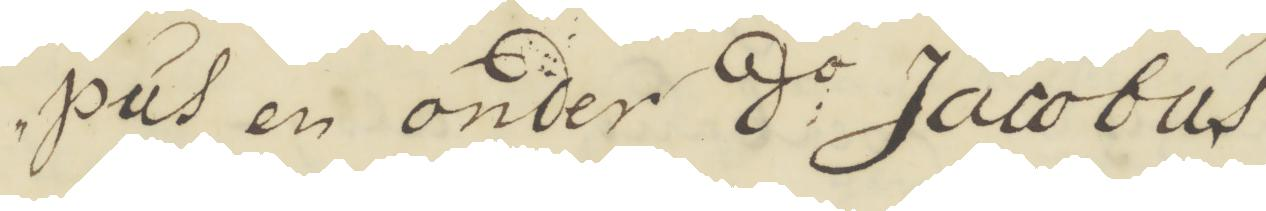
„pus en onder d:o Jacobus
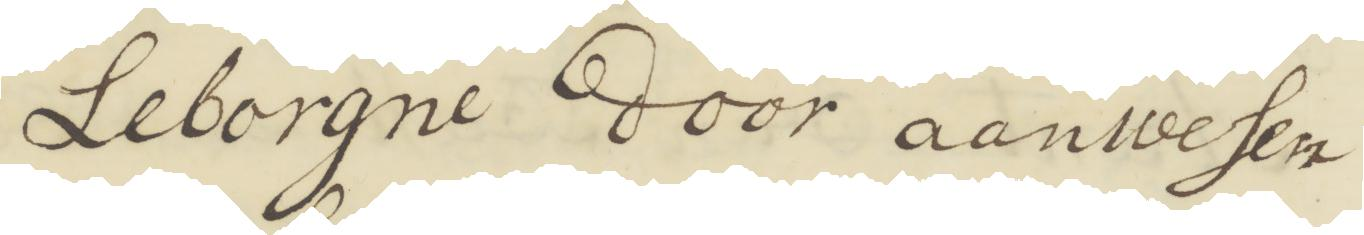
Leborgne door aanwesen
